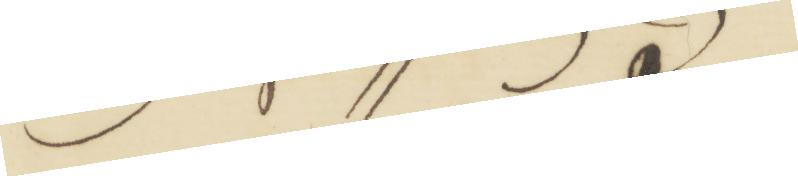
N„33
